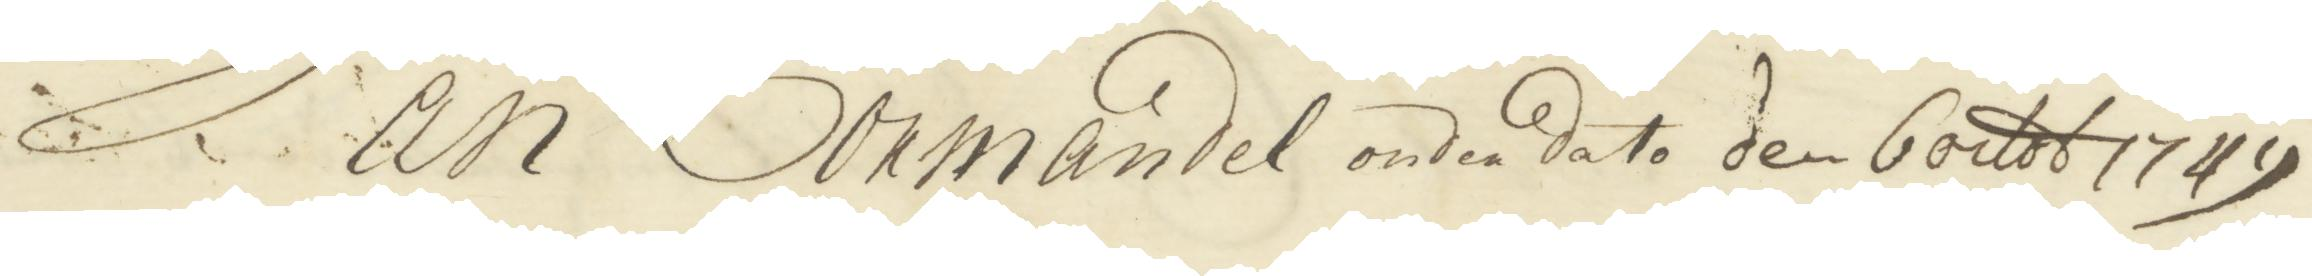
Van Cormandel onder dato den 6 octob 1749
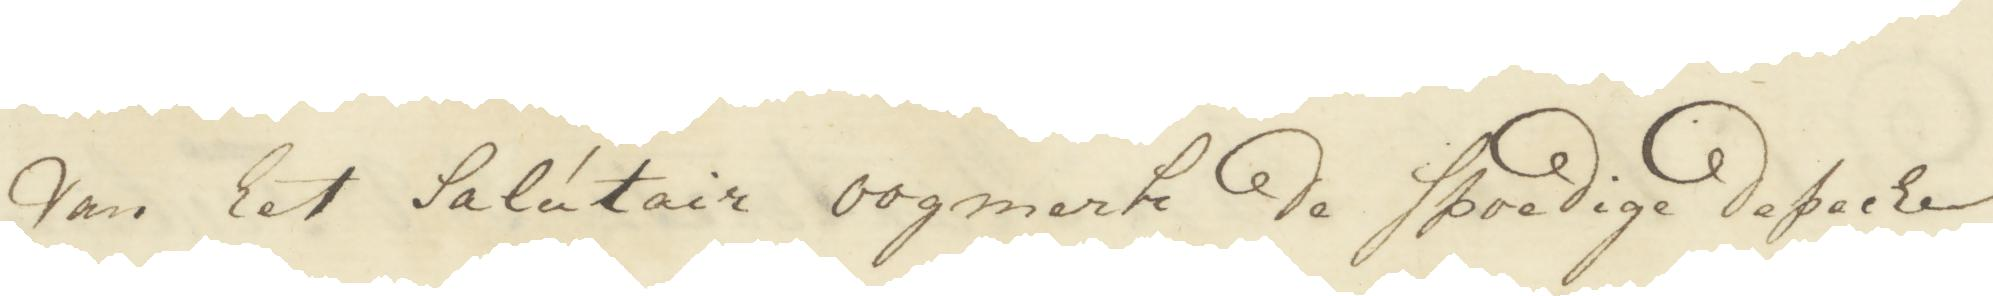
van het salutair oogmerk de spoedige depache
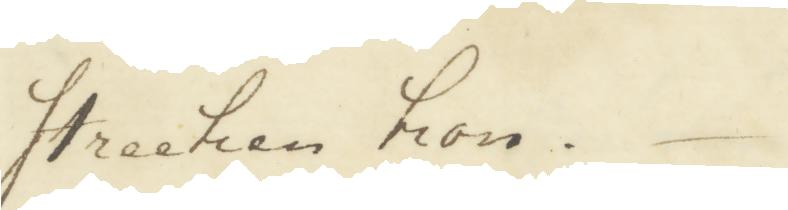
streeken kon. —
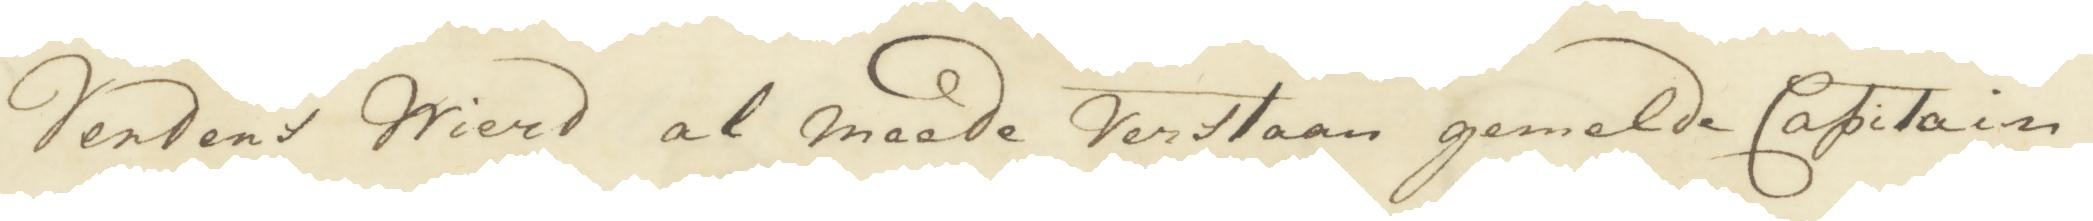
Verders wierd al meede verstaan gemelde Capitain
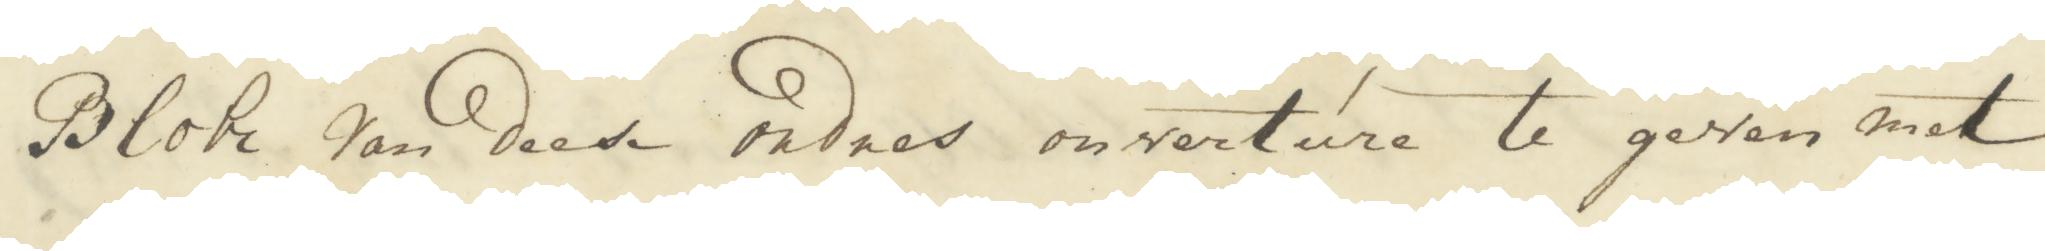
Blok van deese ordres ouverture te geven met
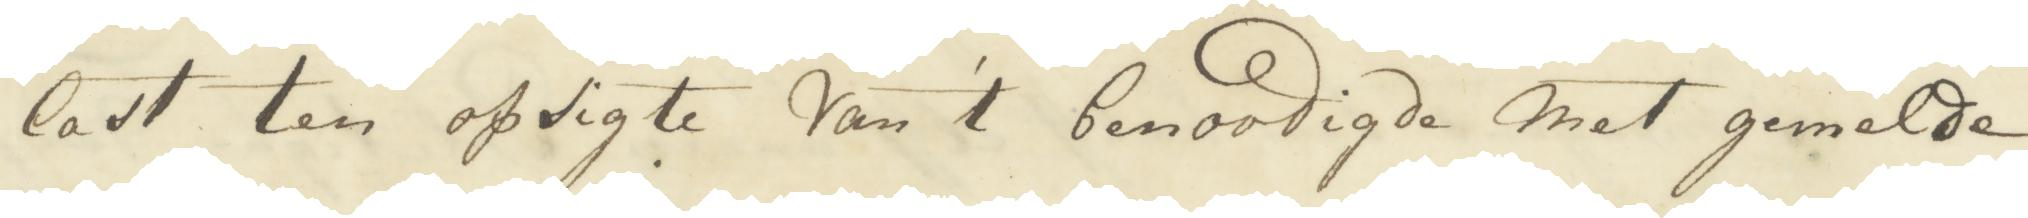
last ten opsigte van ’t benoodigde met gemelde
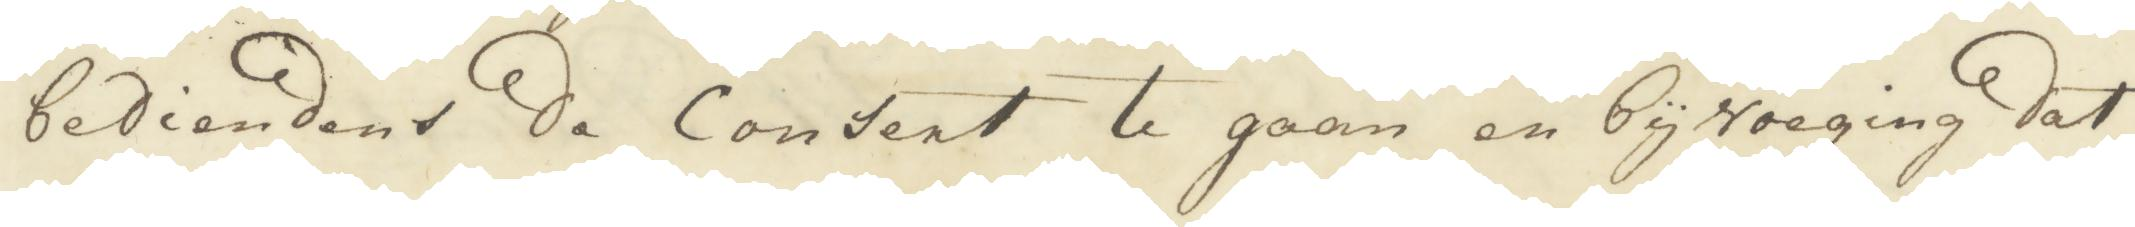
bediendens de consert te gaan en bijvoeging dat
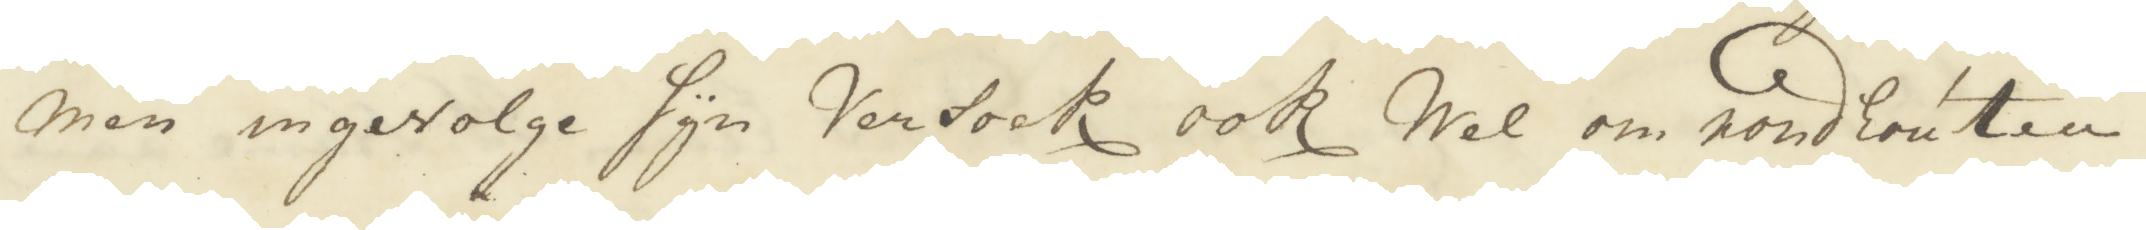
men ingevolge sijn versoek ook wel om rondhouten
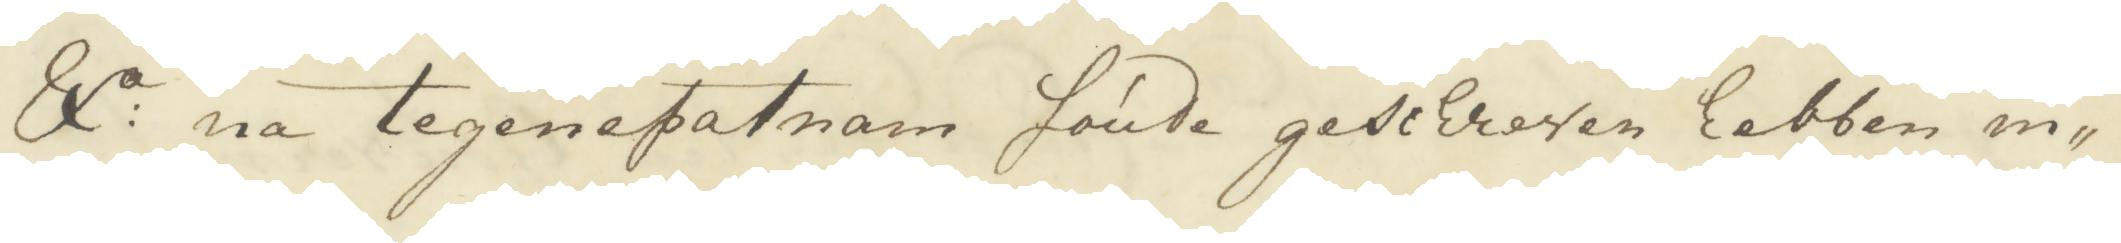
&:a na tegenapatnam soude geschreven hebben in„
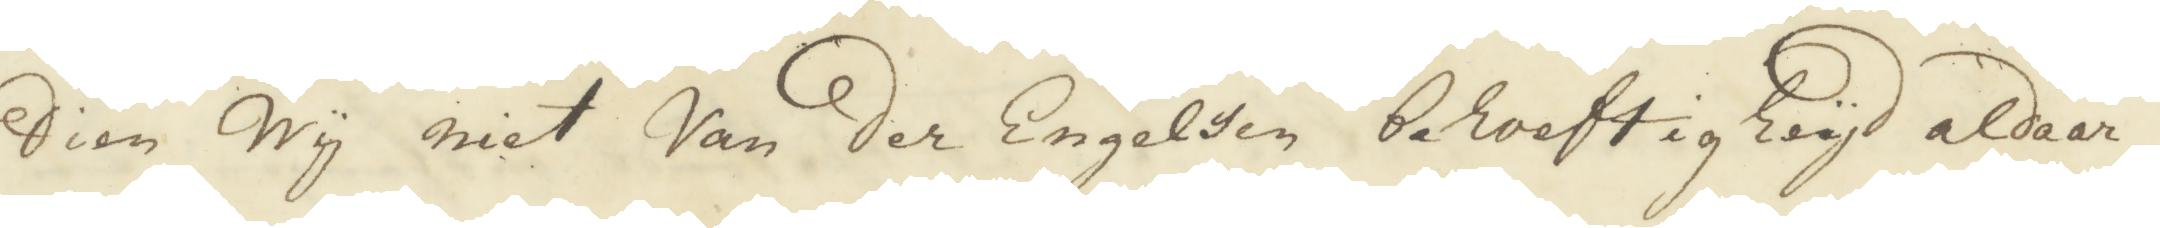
dien wij niet van der Engelsen behoeftigheijd aldaar
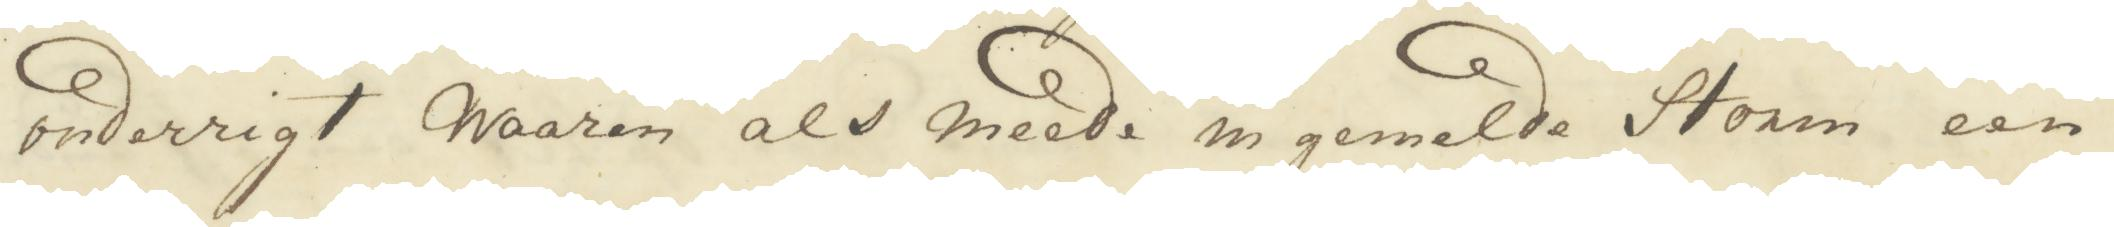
onderrigt waaren als meede in gemelde storm een
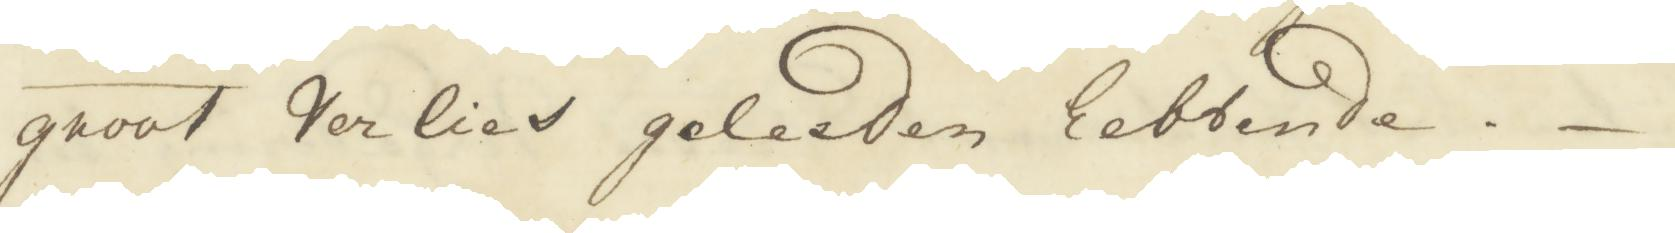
groot verlies geleeden hebbende. —
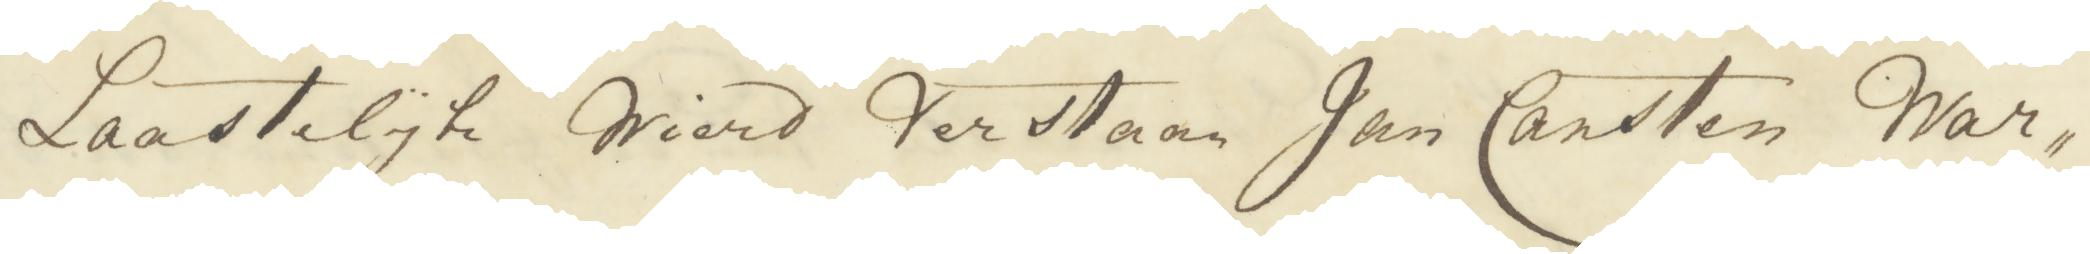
Laastelijk wierd verstaan Jan Carsten War„
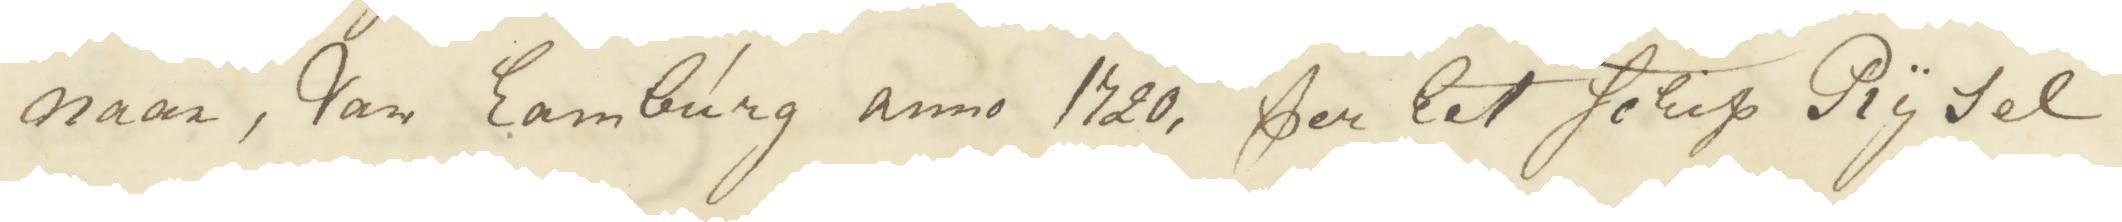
naar, van hamburg anno 1720, per het schip Rijsel
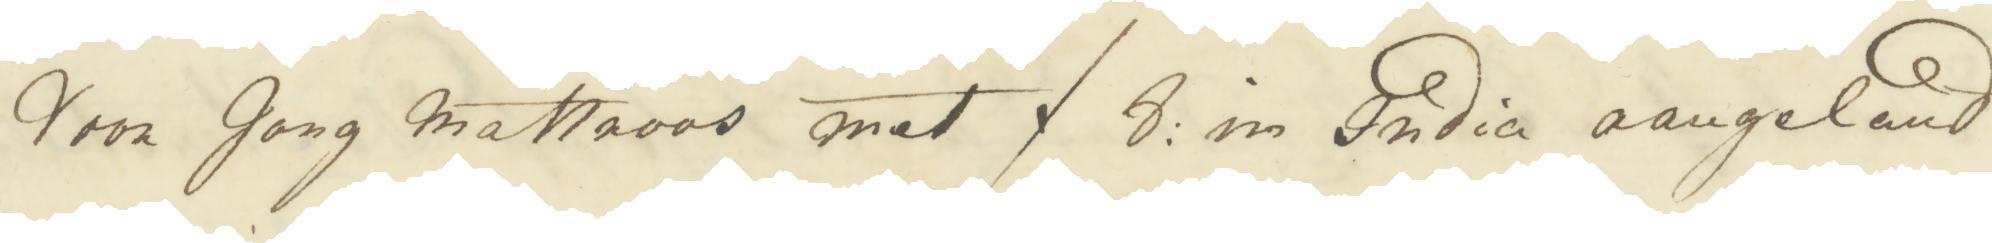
voor Jong mattroos met ƒ 8: in India aangeland
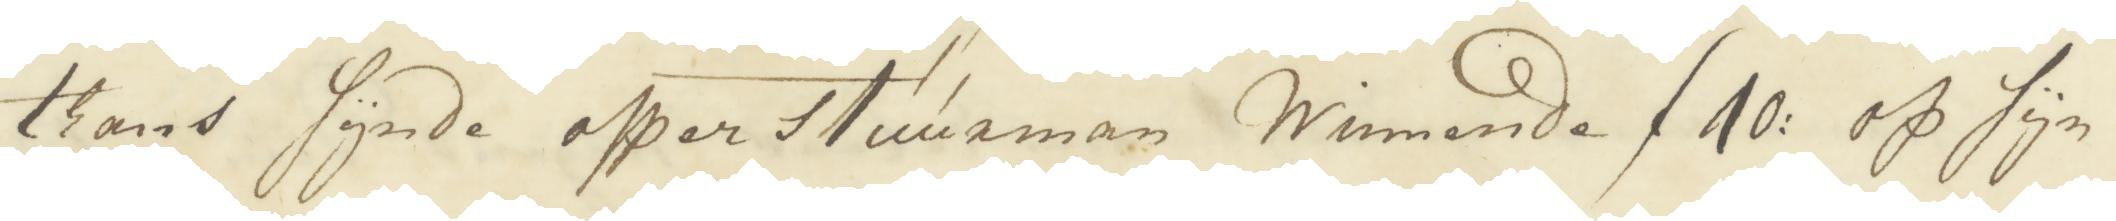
thans sijnde opperstuurman winnende ƒ 40: op sijn
